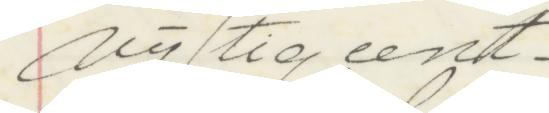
vijftig cent
